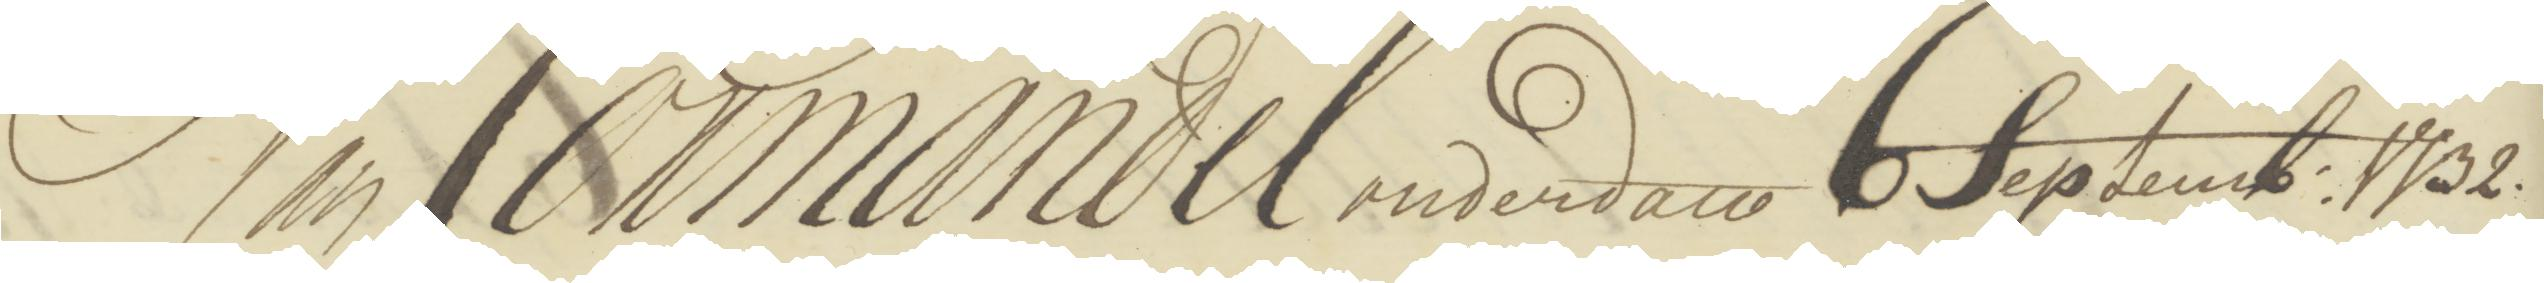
Van Cormandel onderdato 6 Septemb: 1732.
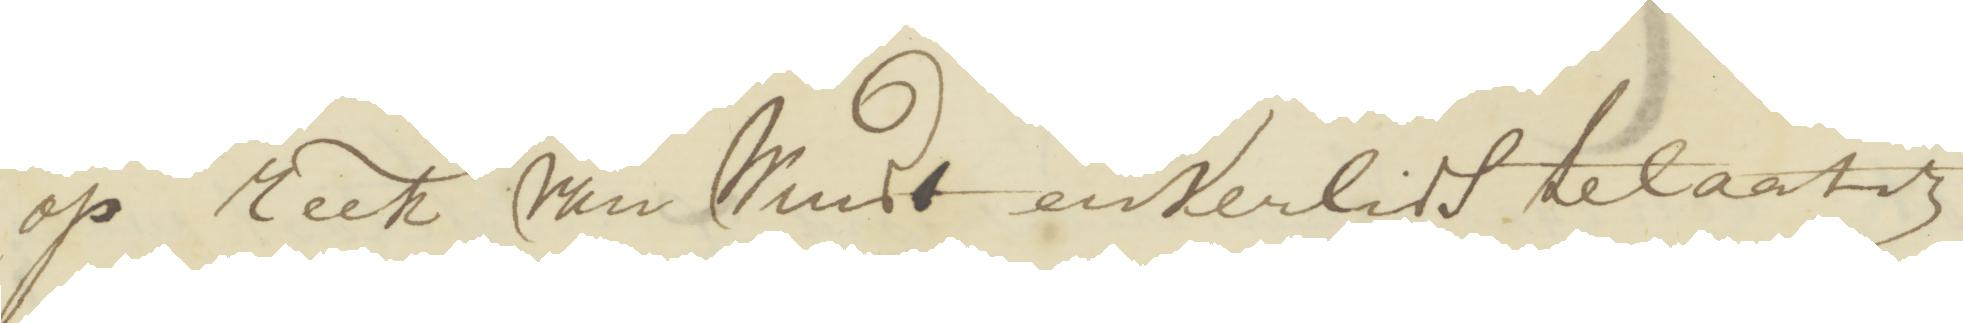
op reek van Winst en verlies te laaten
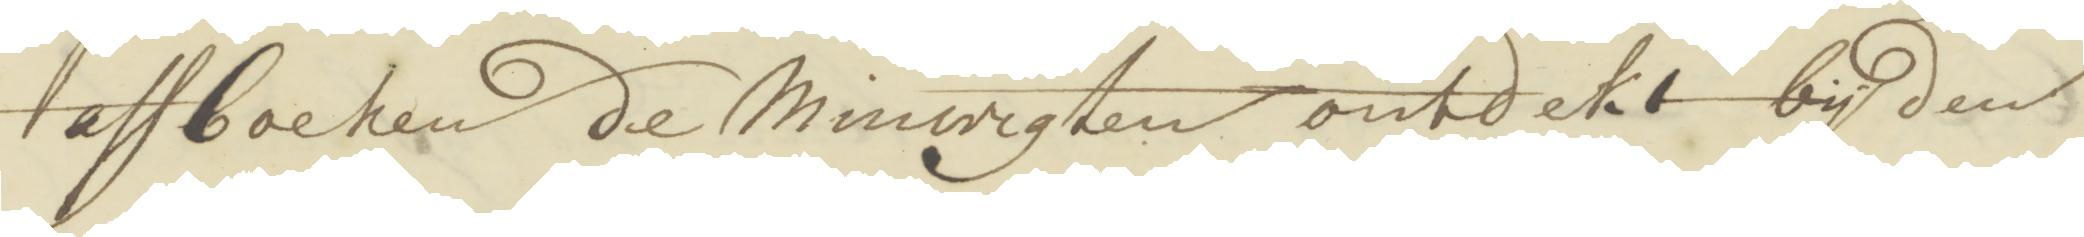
affboeken de minwigten ontdekt bij den
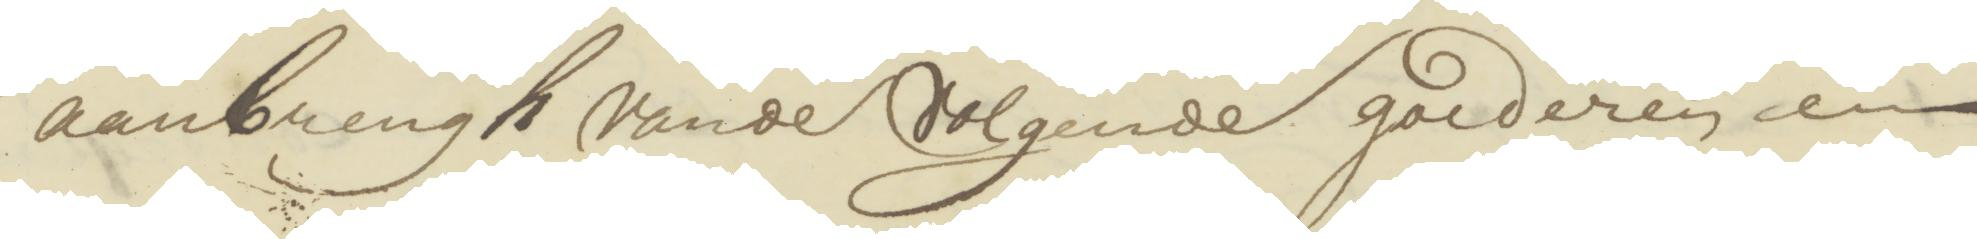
aanbrengh van de volgende goederen en
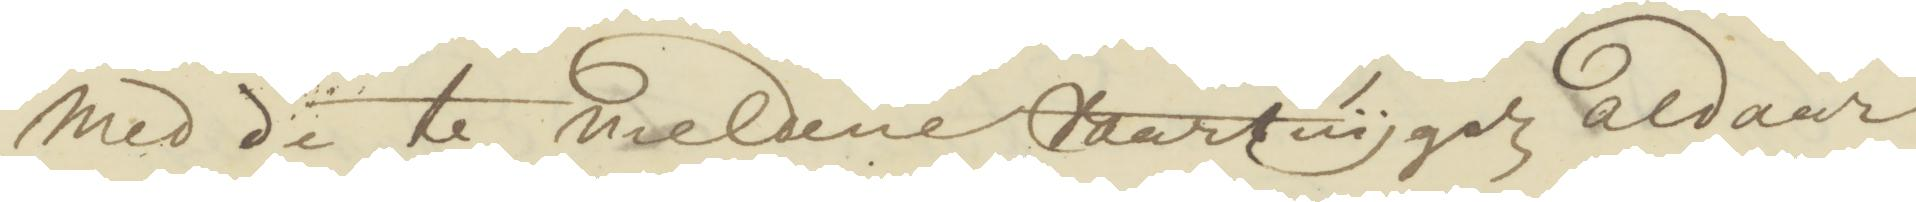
med de te meldene vaartuijgen aldaar
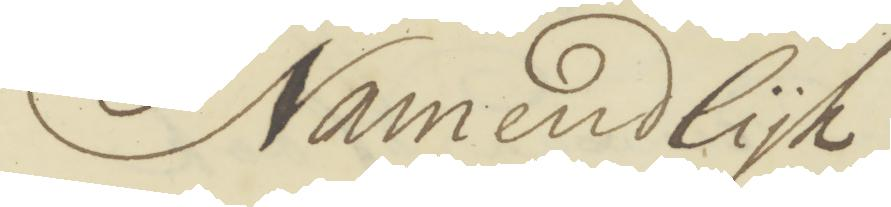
Namendlijk
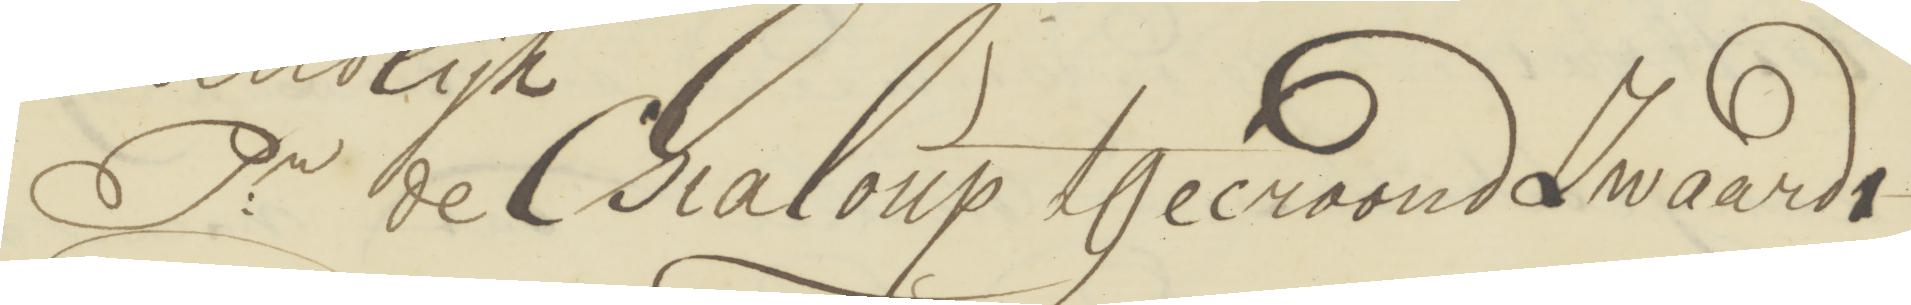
P:r de Chialoup t gecroond Zwaardt
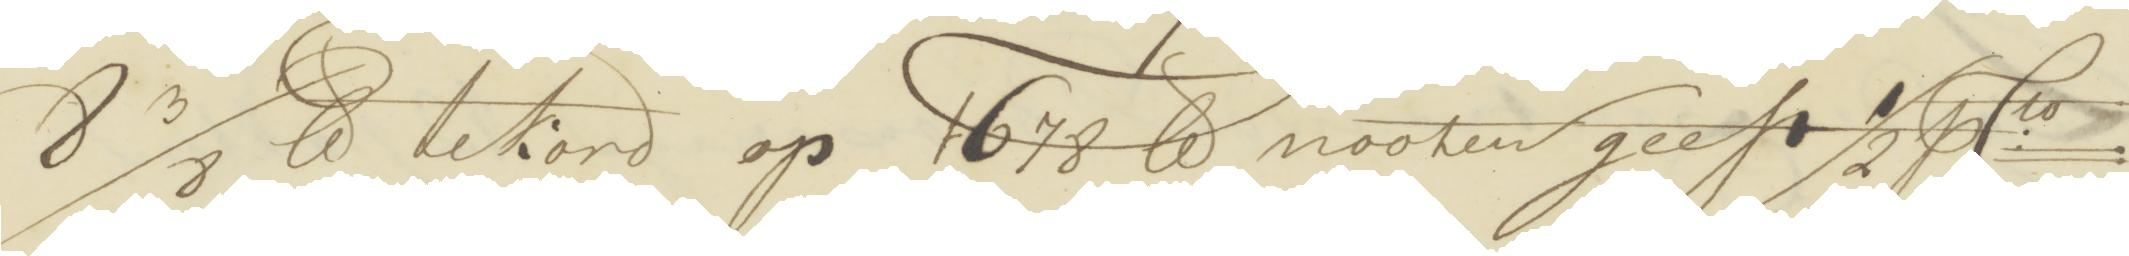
8 3/8 lb tekord op 1678 lb nooten geeft ½ pC=:to
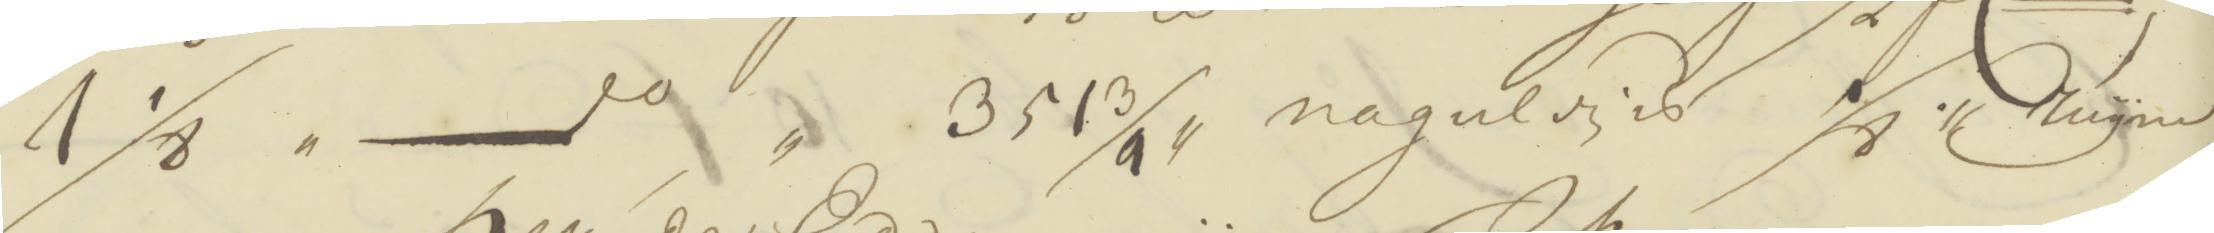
4 1/8 „ _o „ 351¾ „ nagulen is 1/8 .„ ruijm
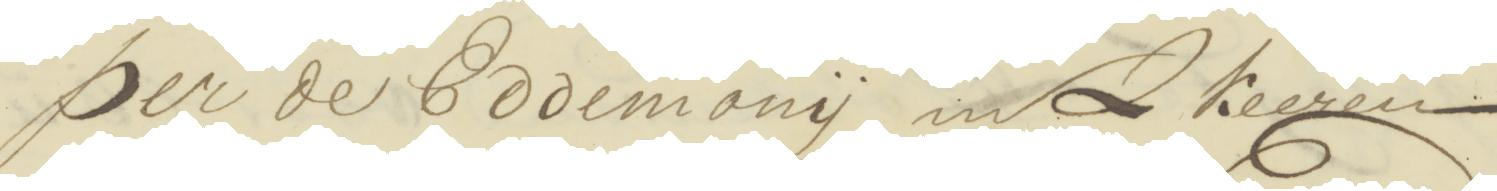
per de Eddemonij in 2 keeren
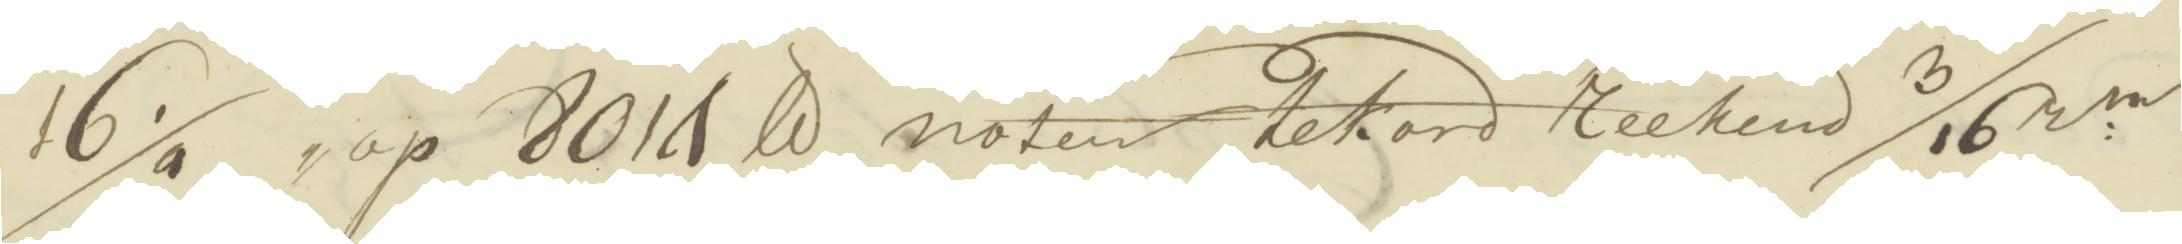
16¼ „ op 8014 lb noten tekord reekend 3/16 r:m
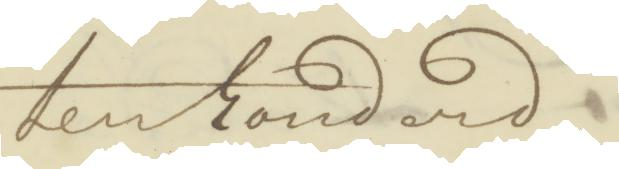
ten honderd
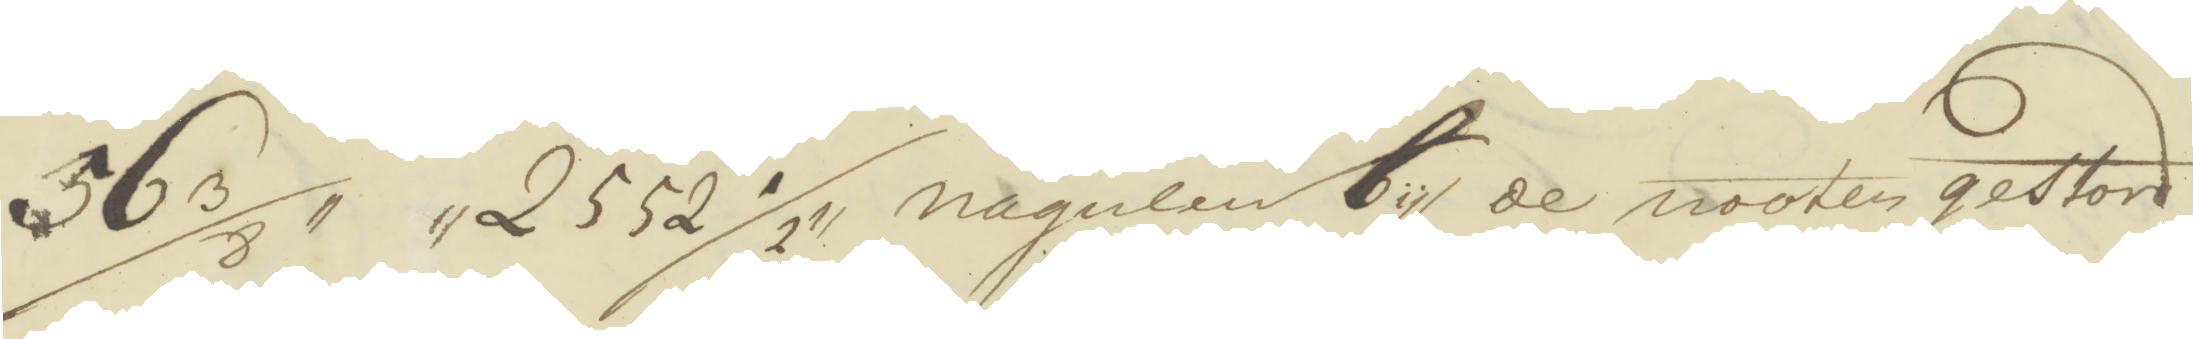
56 3/8 „ „ 2552½ „ nagulen bij de nooten gestord
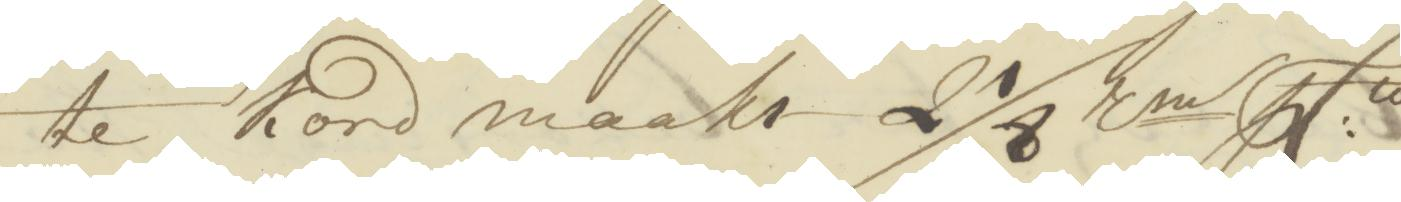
te kord maakt 2 1/8 r=m pC:to
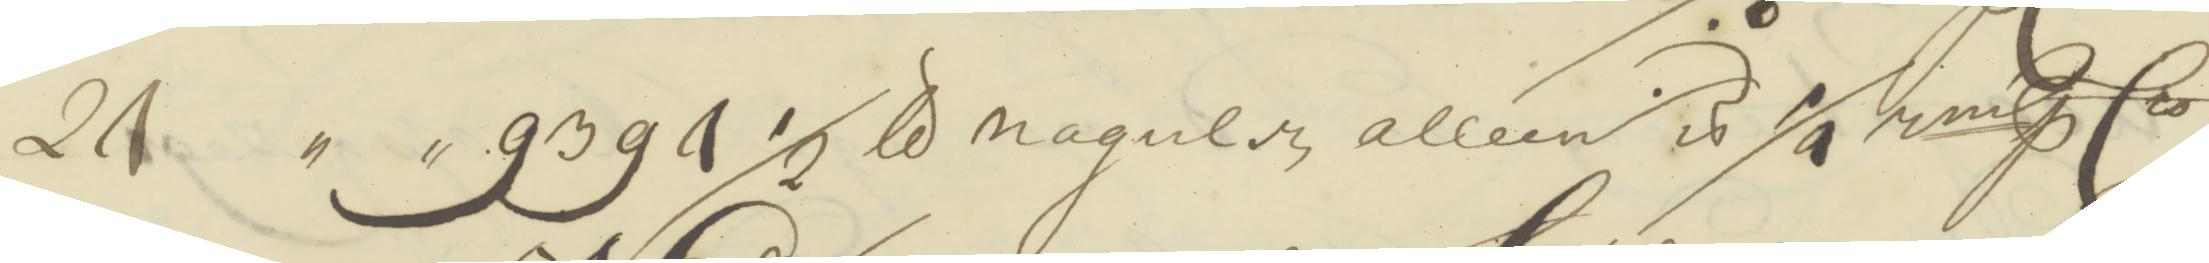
24 „ „ 9394½ lb nagulen alleen is ¼ r=m pCto
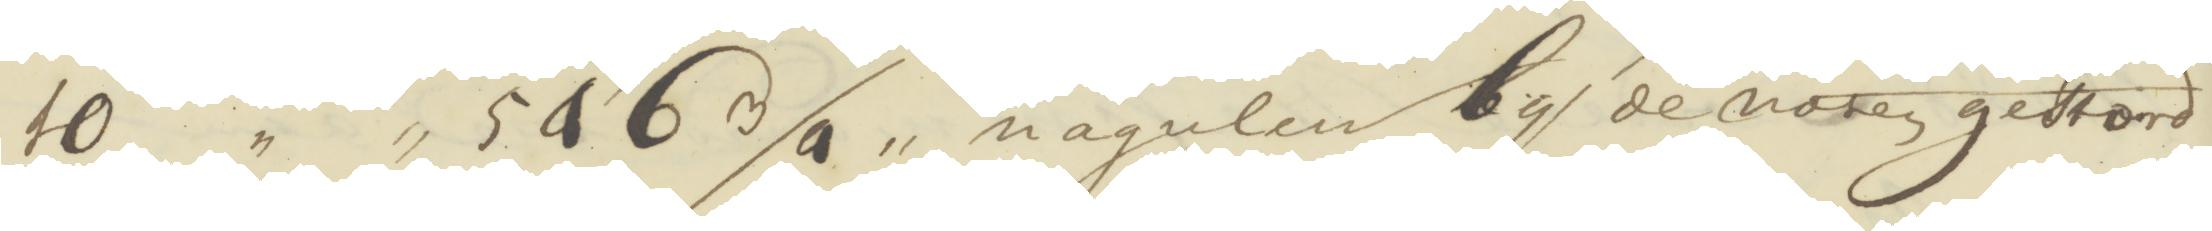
10 „ „ 546¾ „ nagulen bij de noten gestord
